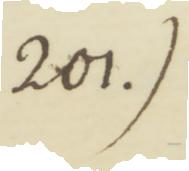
201./
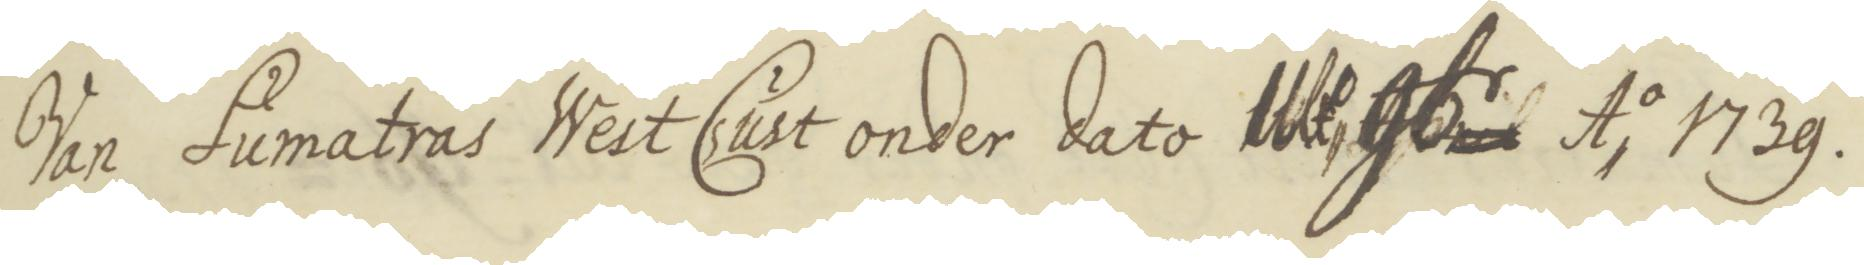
Van Sumatras West Cust onder dato ult„o 9b=r A„o 1739.
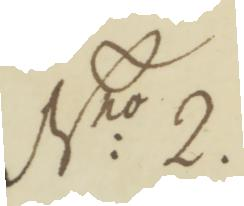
N:ro 2.
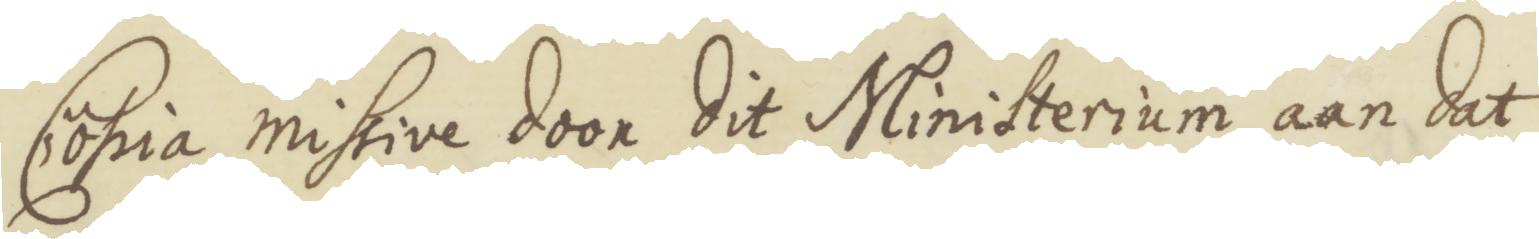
Copia missive door dit Ministerium aan dat
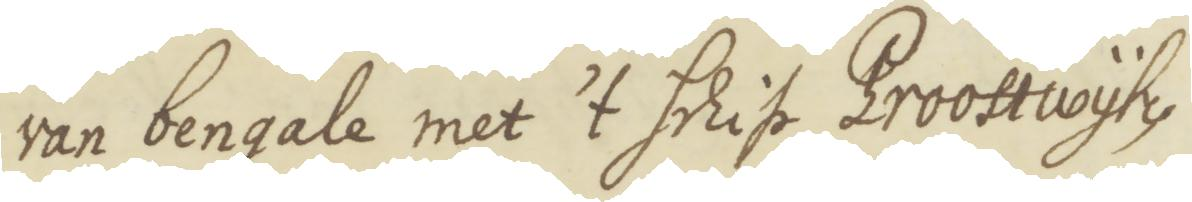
van bengale met ’t schip Proostwijk
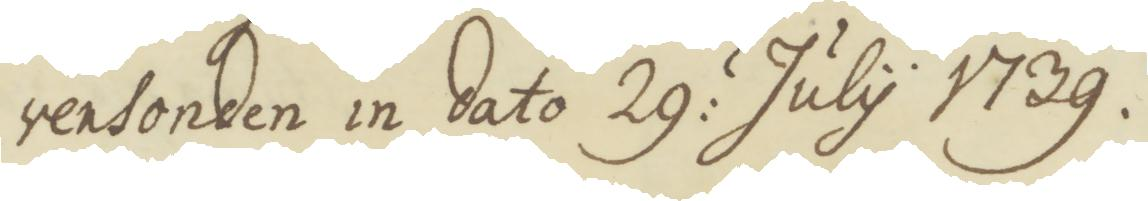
versonden in dato 29:' Julij 1739.
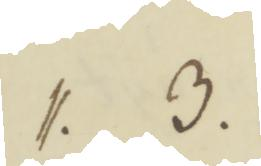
„. 3.
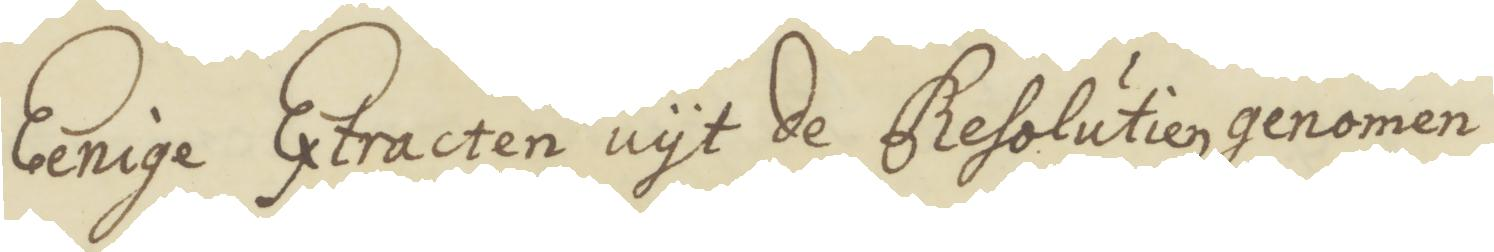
Eenige Extracten uijt de Resolutien genomen
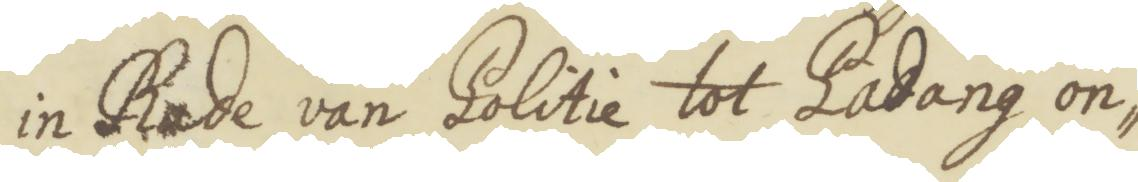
in Rade van Politie tot Padang on„
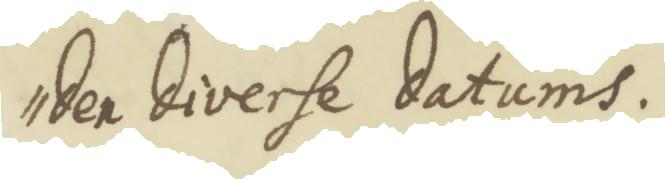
„der diverse datums.
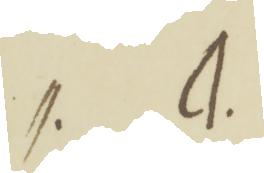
„. 4.
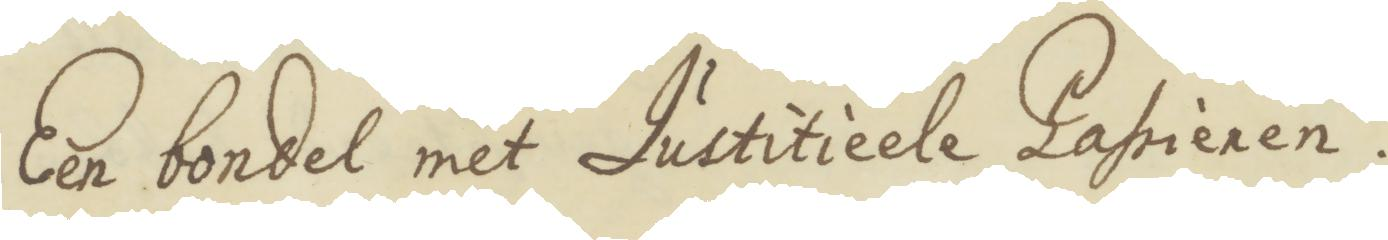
Een bondel met Iustitieele Papieren.
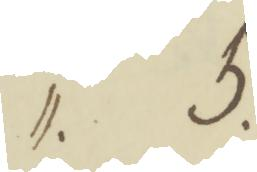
„. 5.
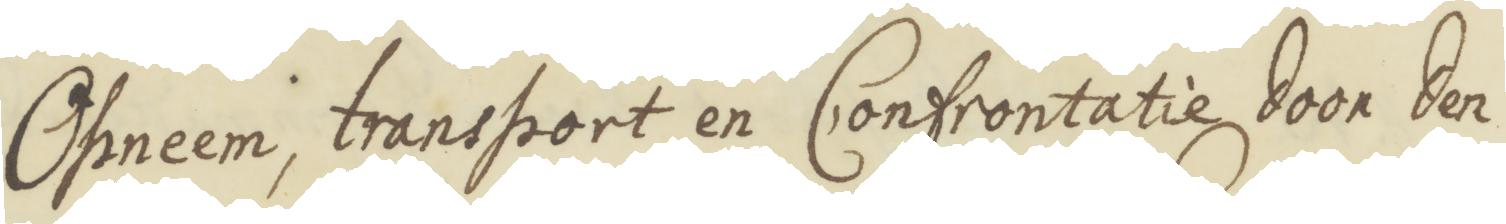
Opneem, transport en Confrontatie door den
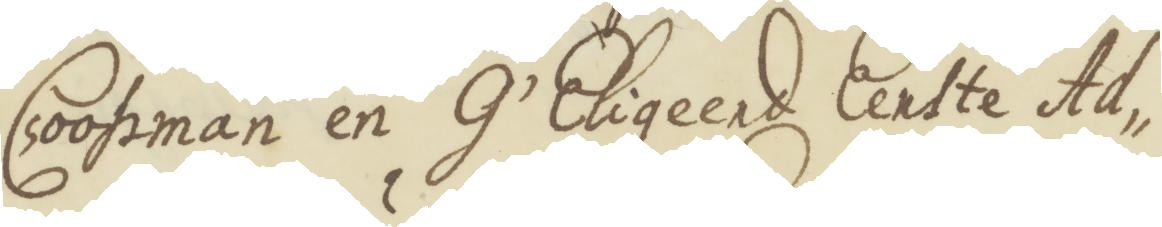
Coopman en g'Eligeerd Eerste Ad„
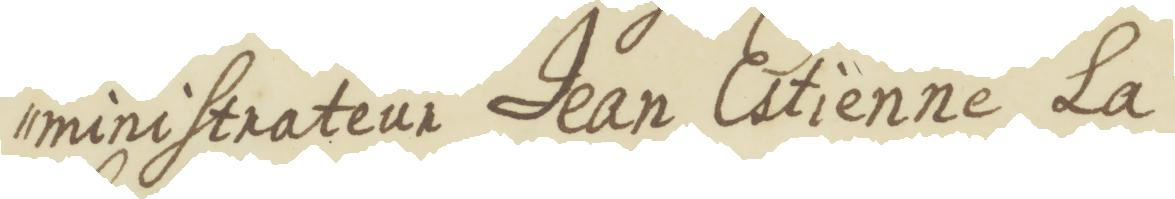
„ministrateur Jean Estienne La
